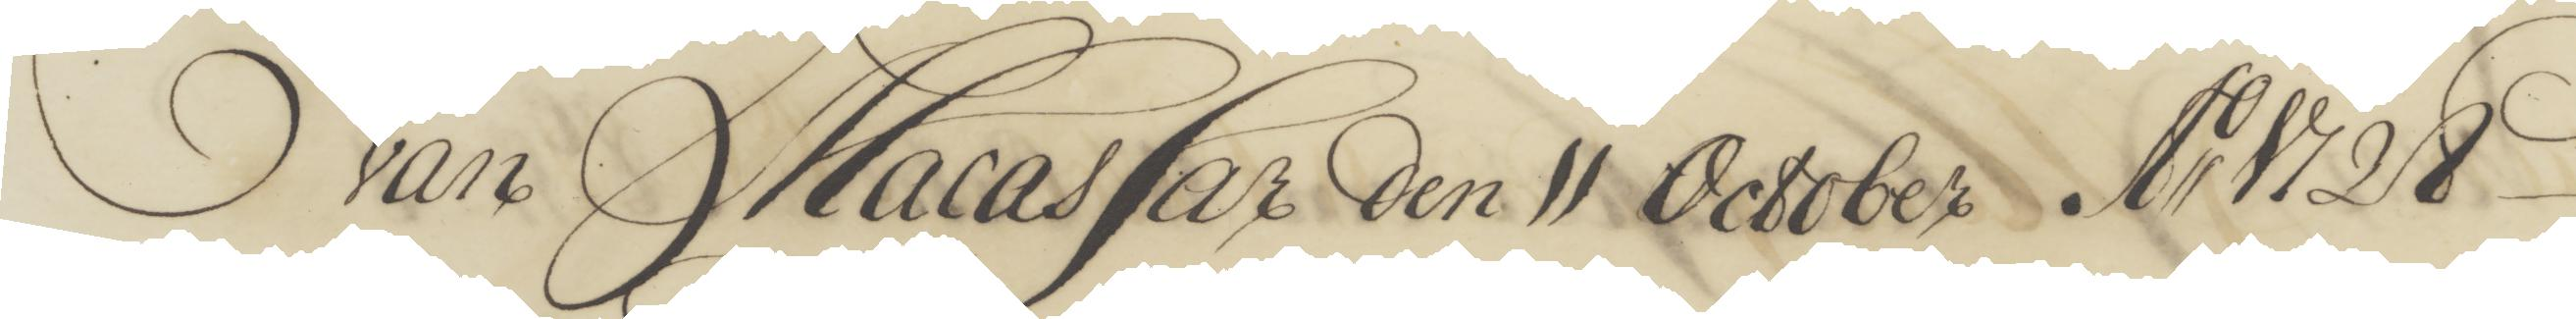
Van Macassar den 11 October A„o 1728
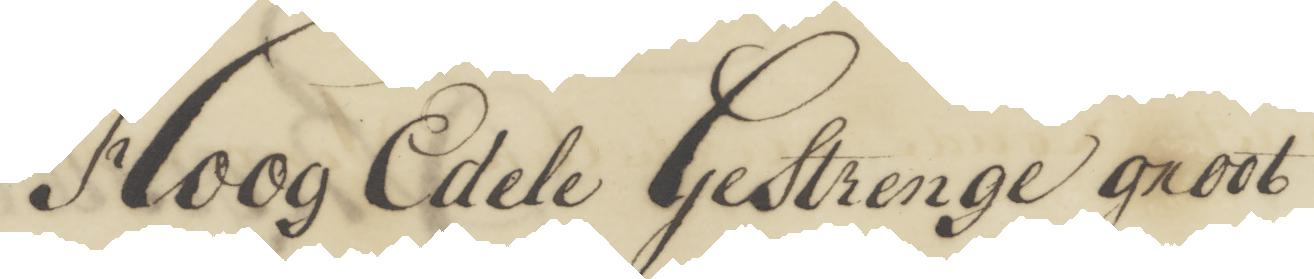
Hoog Edele Gestrenge groot
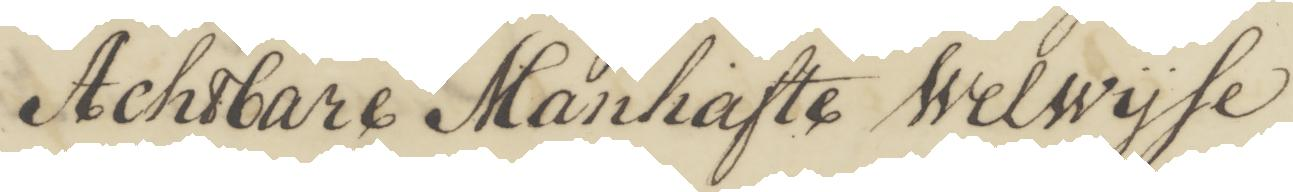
Achtbare Manhafte Welwijse
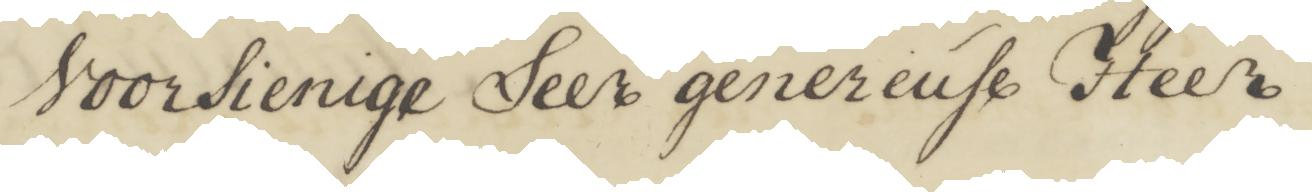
voorsienige Seer genereuse Heer
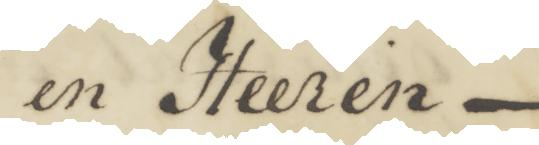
en Heeren —
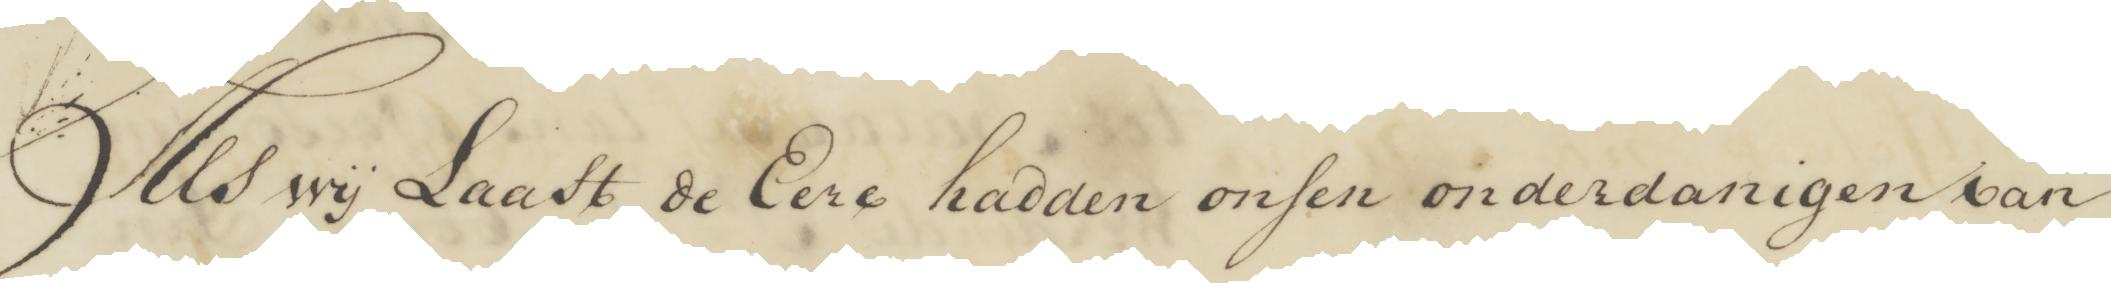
Als wij Laast de Eere hadden onsen onderdanigen van
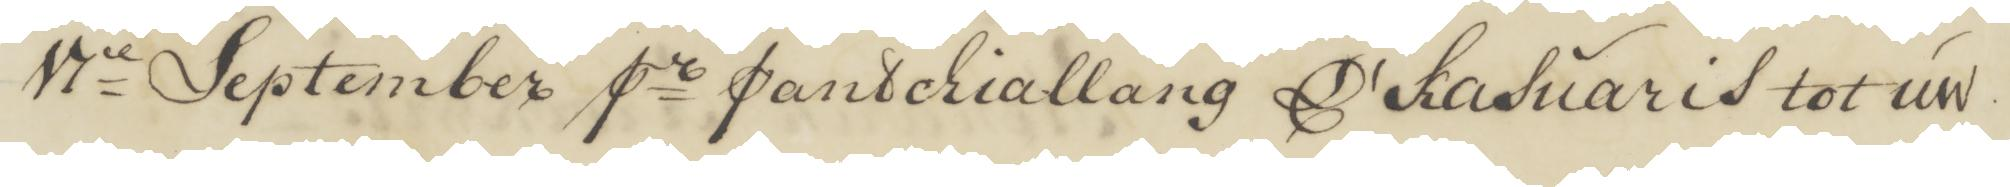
17=e September p=r pantchiallang te' Kasuaris tot uw
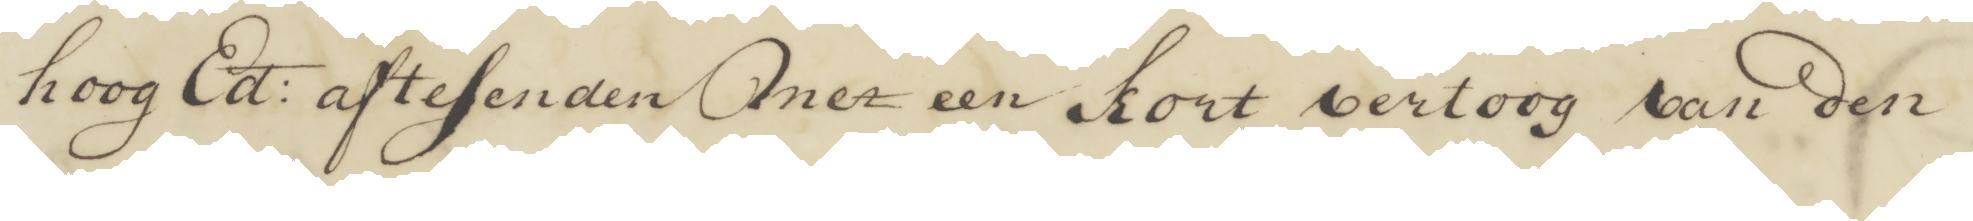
hoog Ed: aftesenden met een kort vertoog van den
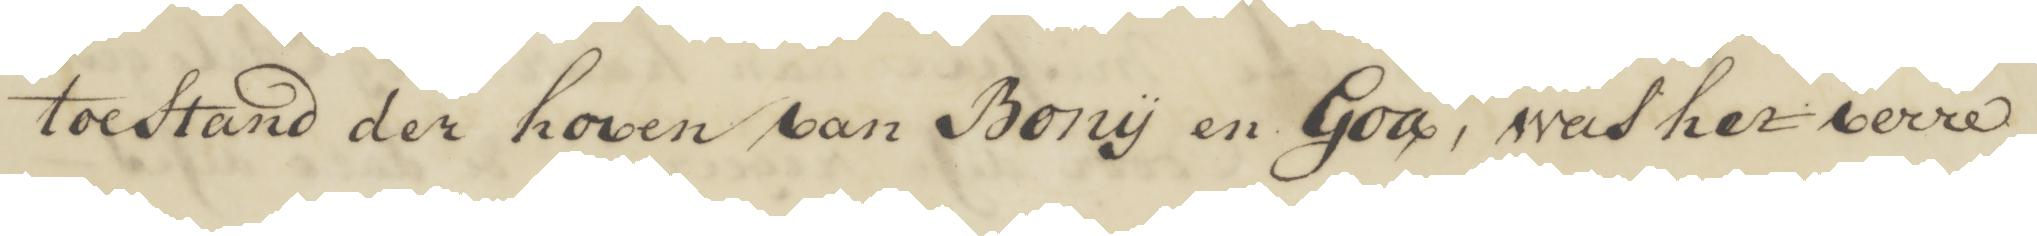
toestand der hoven van Bonij en Goa, was het verre
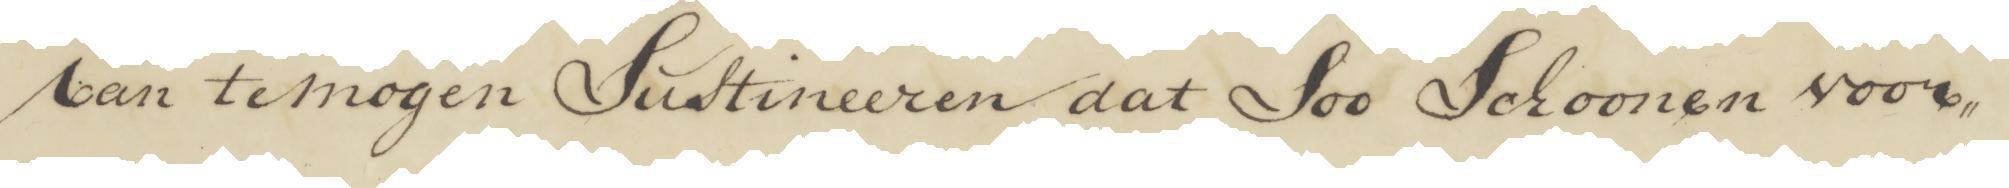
van te mogen Sustineeren dat Soo Schoonen voor„
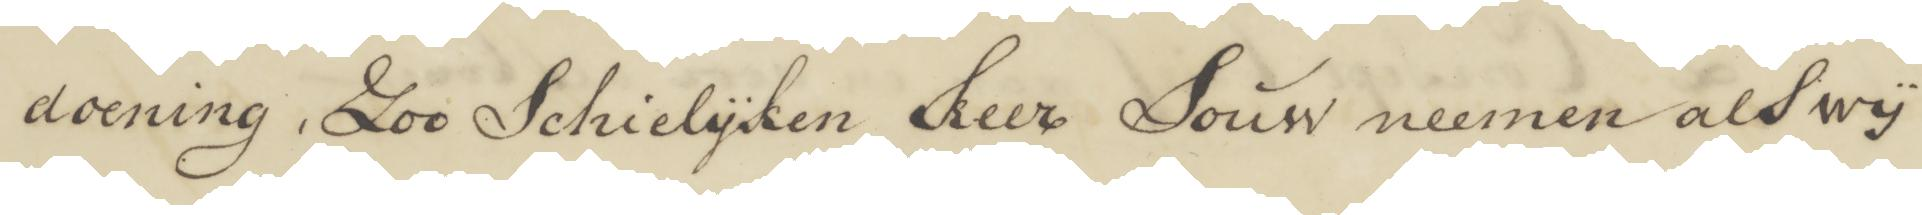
doening, zoo Schielijken keer Souw neemen als wij
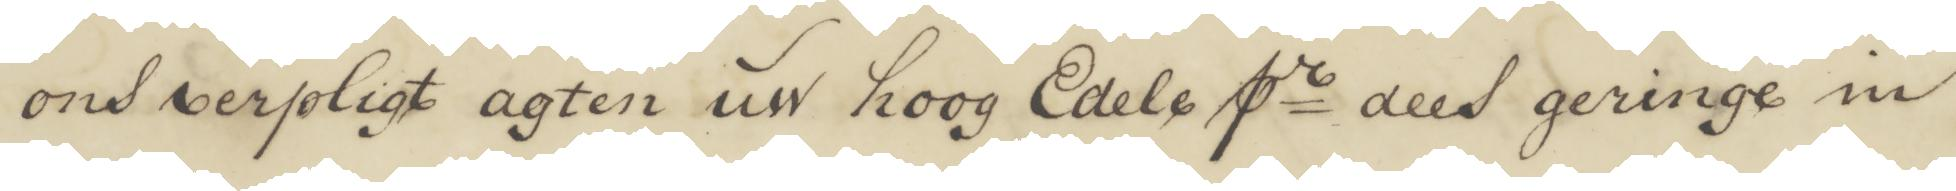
ons verpligt agten uw hoog Edele p=r dees geringe in
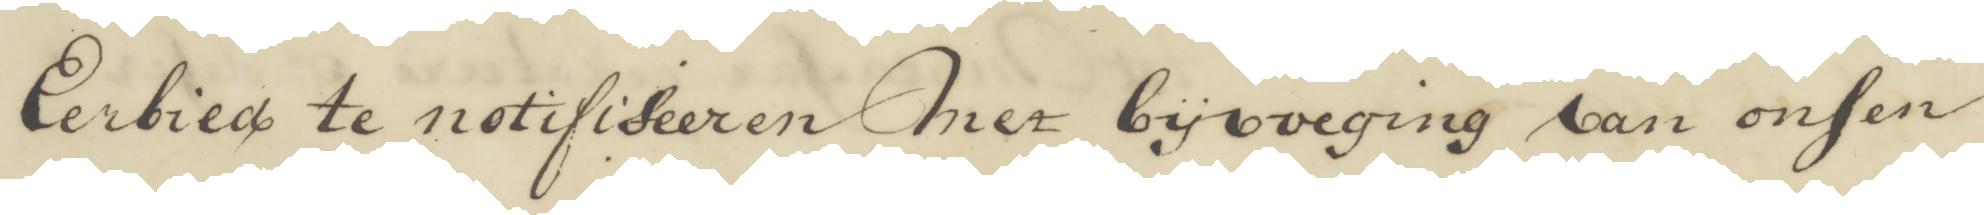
Eerbied te notifiseeren met bijvoeging van onsen
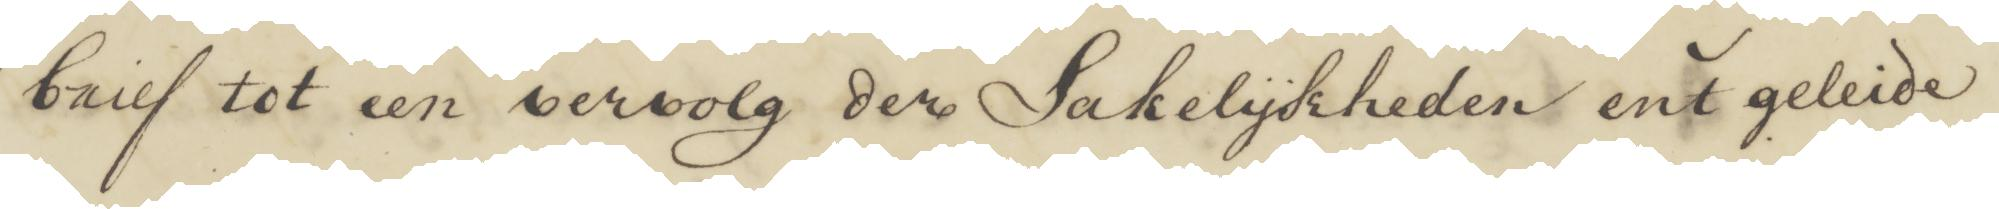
brief tot een vervolg der Sakelijkheden en’t geleide
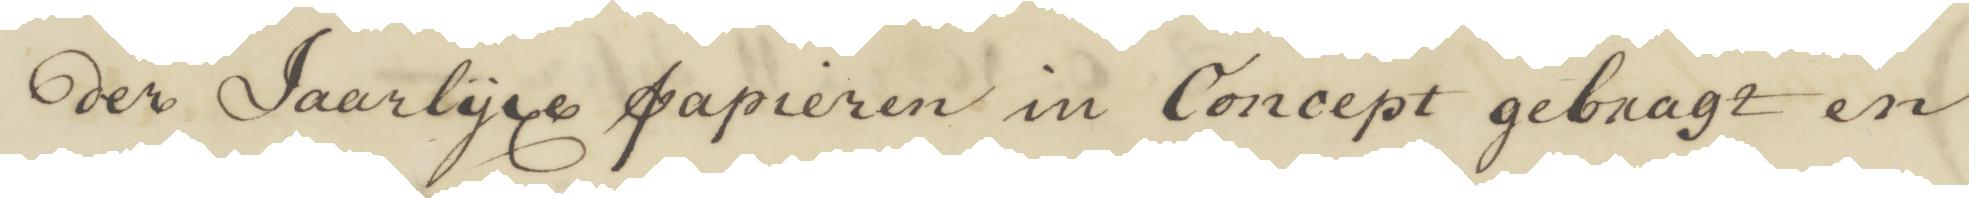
der Iaarlijxe papieren in Concept gebragt en
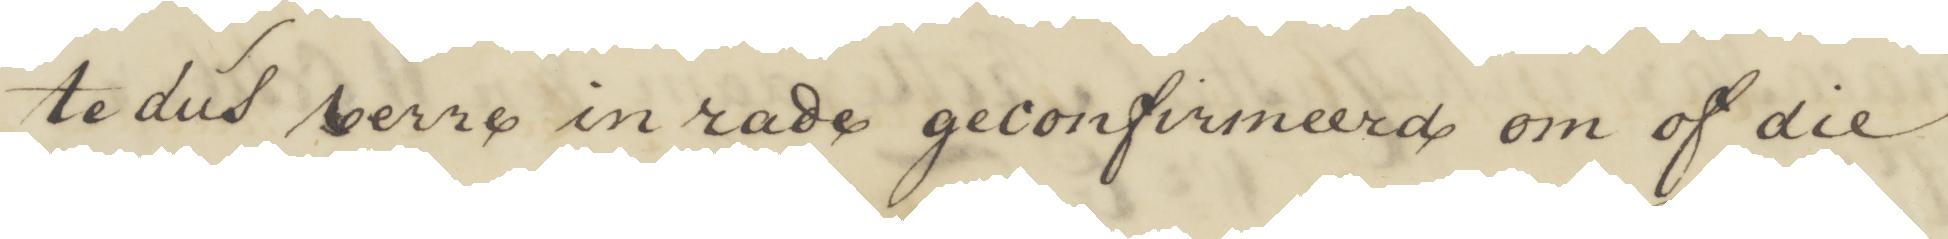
te dus verre in rade geconfirmeerd om of die
